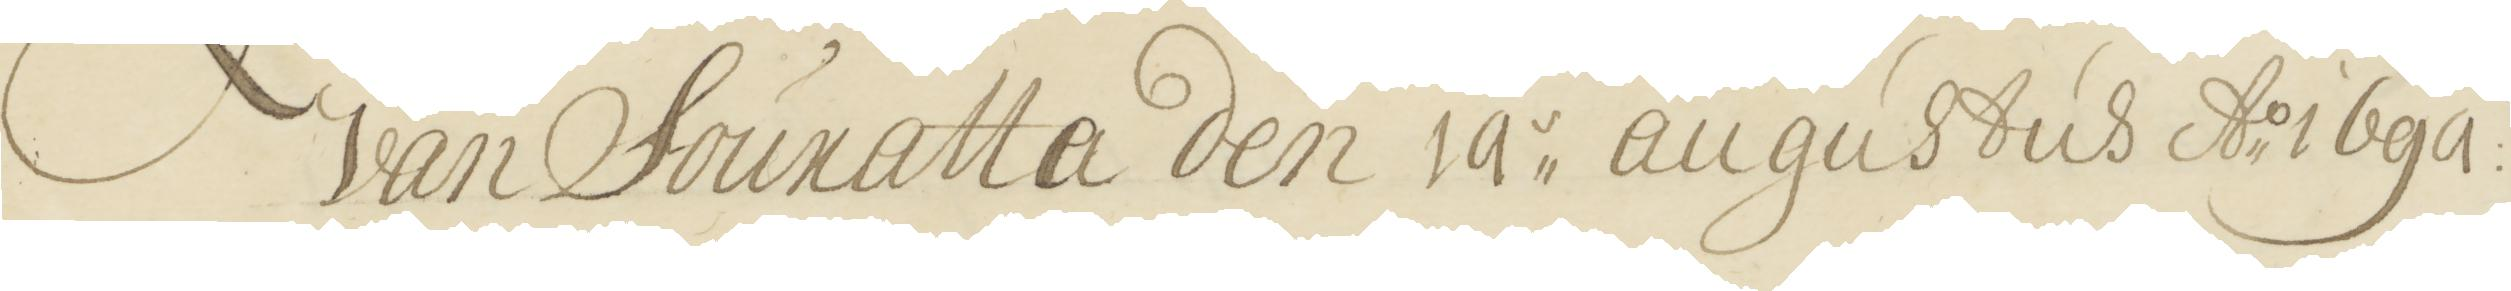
Van Souratta den 14„e augustus A„o 1694:
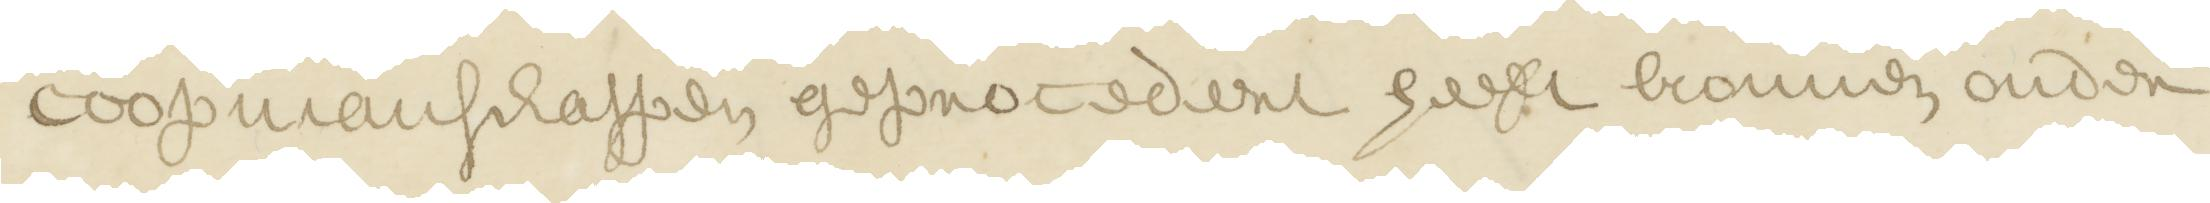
coopmanschappen geprocedeert heeft konnen onder
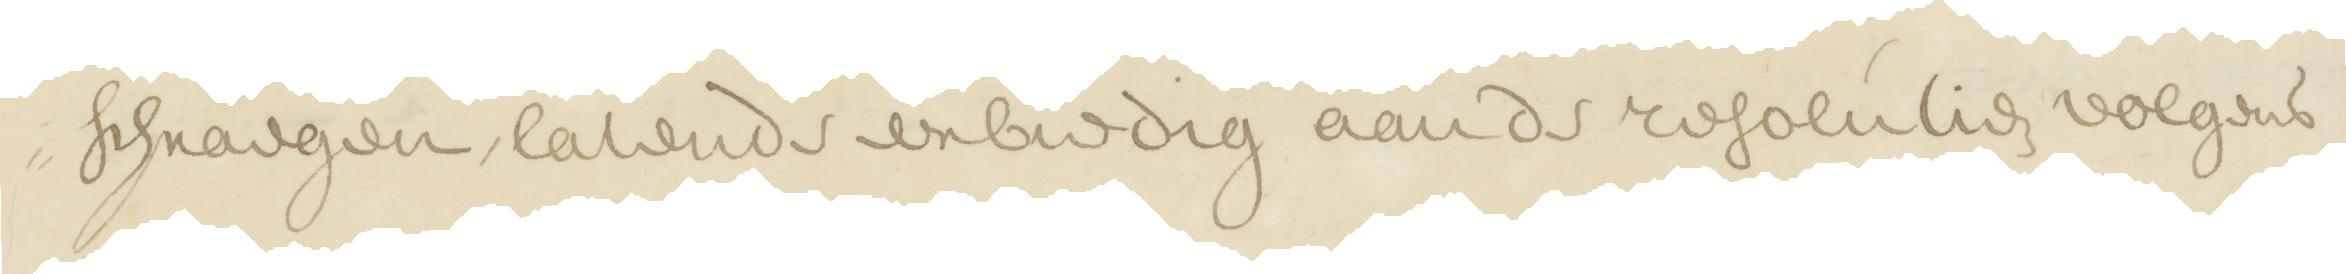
„schraegen, latends eerbiedig aan de resolutien volgens
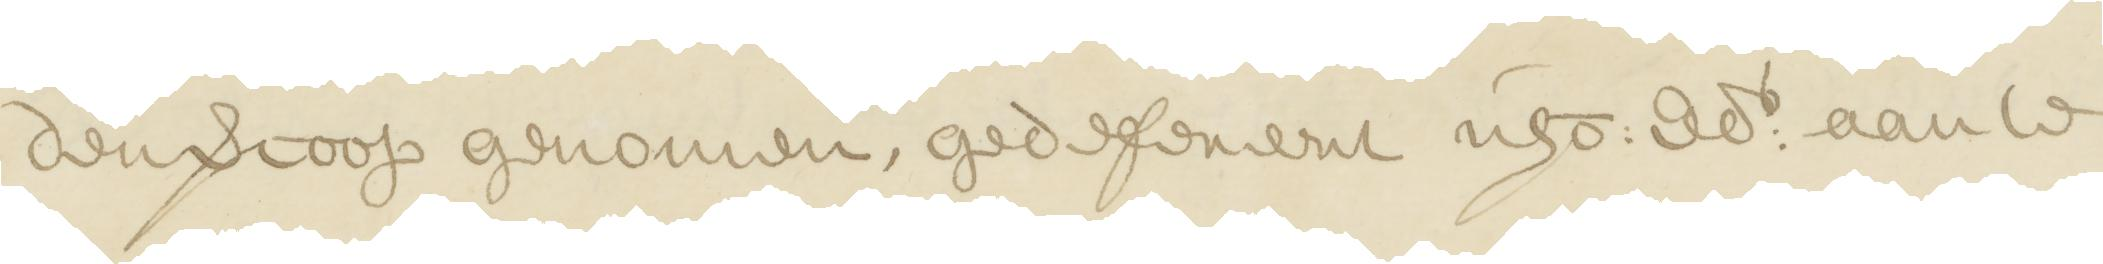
denvercoop genomen, gedefereert uho: Ed:s aan te
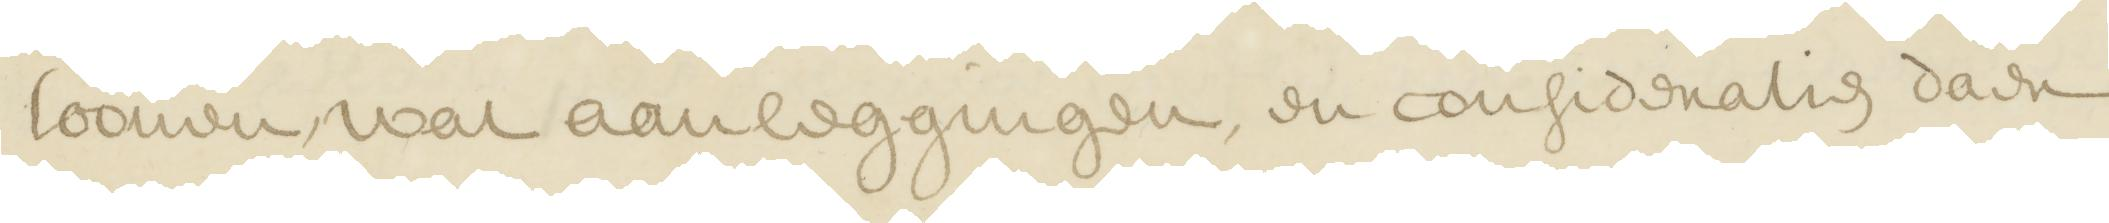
toonen, wat aanleggingen, en consideratien daer
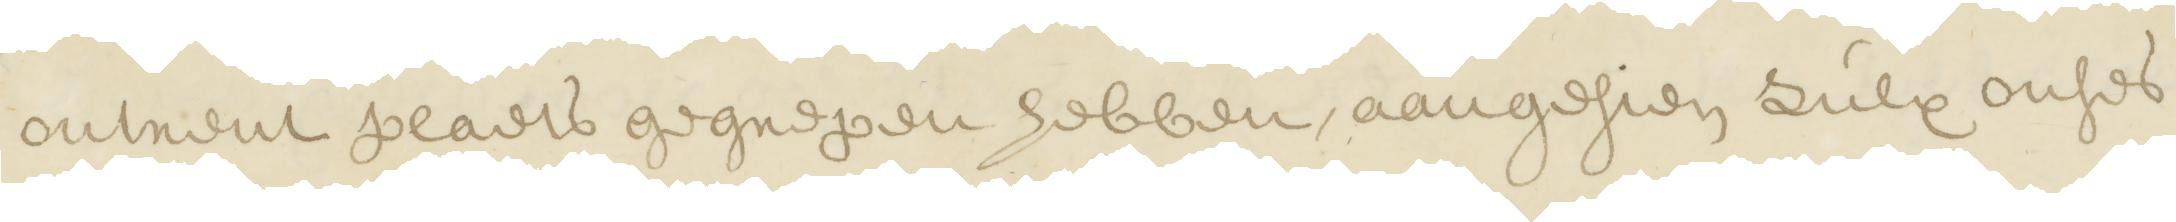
ontrent plaets gegrepen hebben, aangesien zulx onses
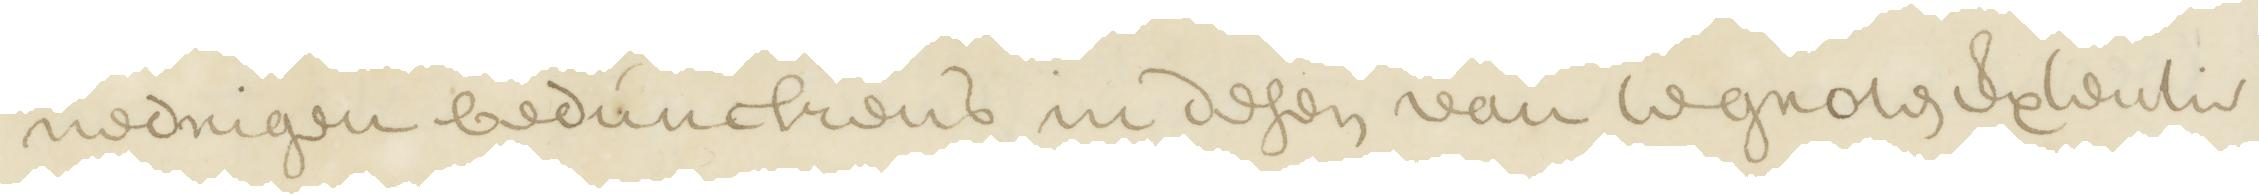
nedrigen bedunckens in desen van tegroten Extentie
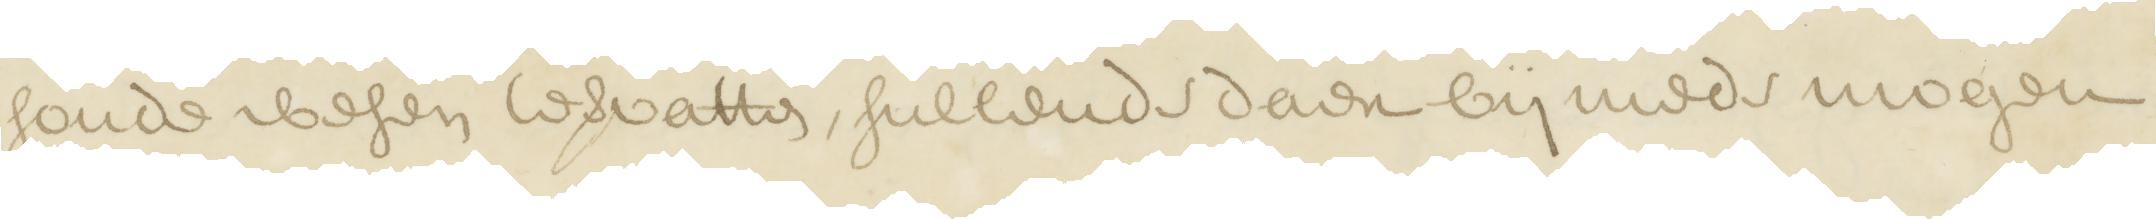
soude wesen te vervatten, sullende daer bij mede mogen
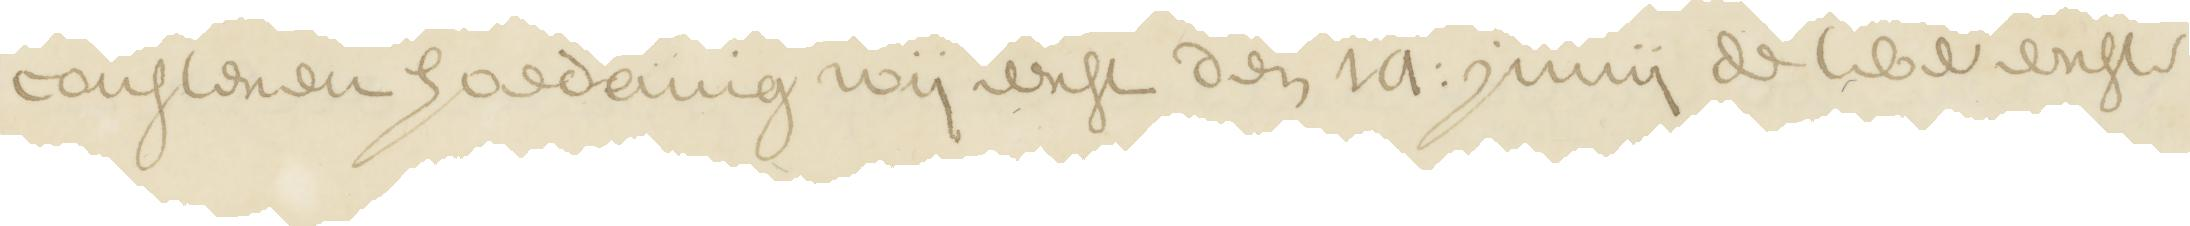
consteren hoedanig wij eerst den 14: junij de twe erste
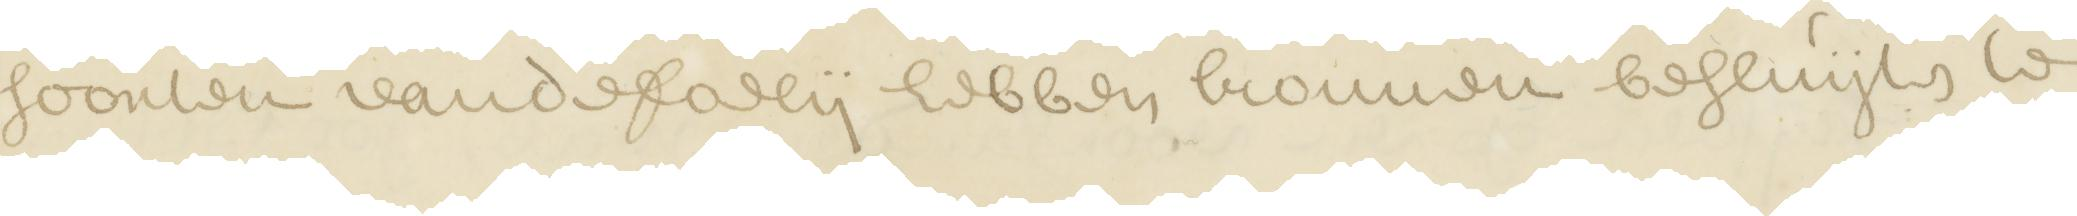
soorten vandefoelij hebben konnen besluijten te
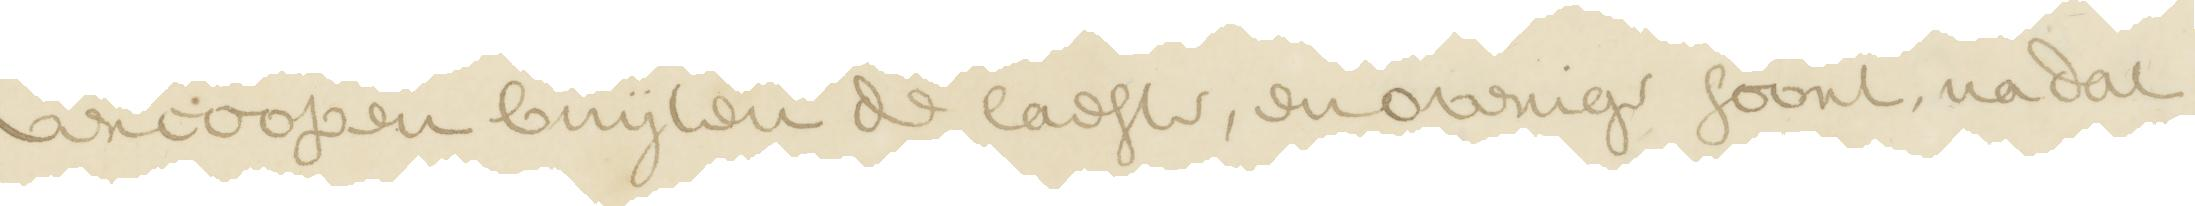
vercoopen buijten de laeste, en overige soort, na dat
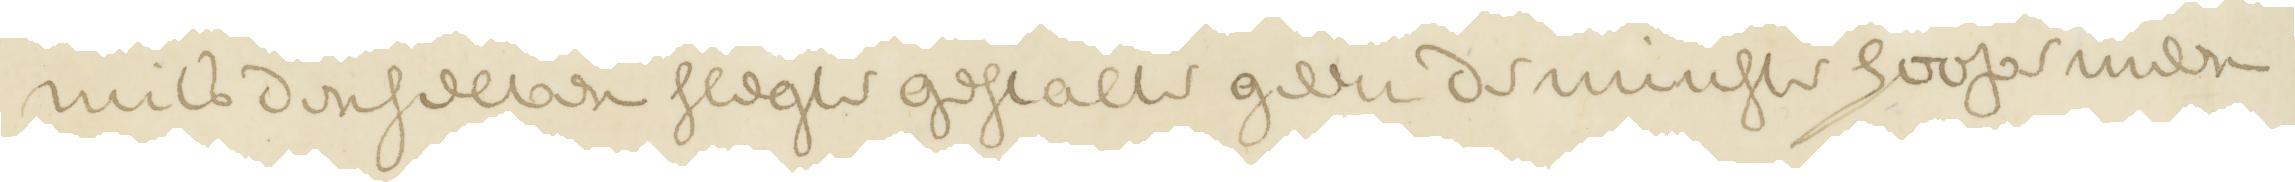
mits derselver slegte gestalte geen de minste hoope mer
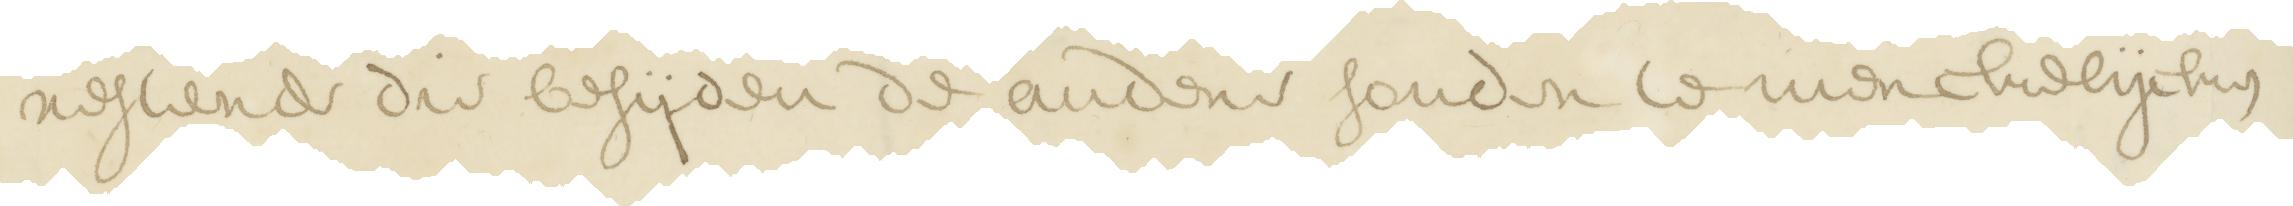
resterde die besijden de andere sonder te merckelijcken
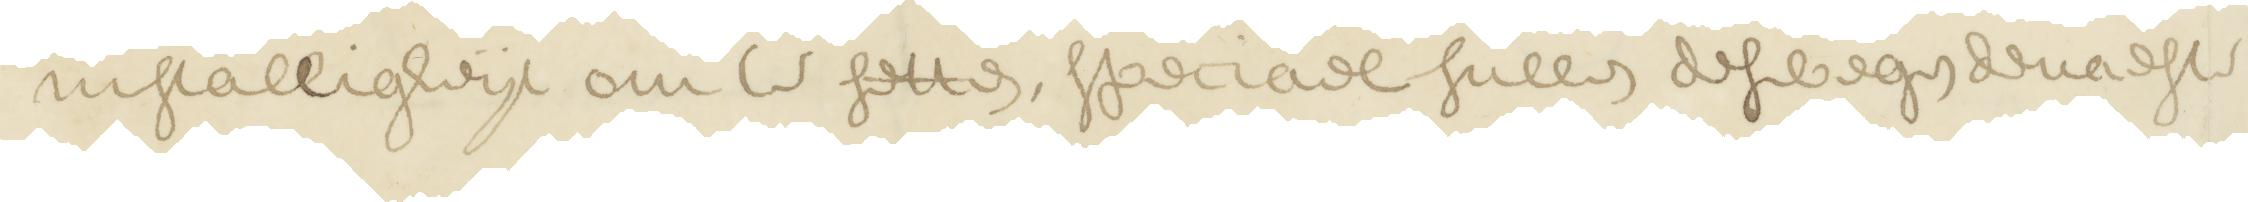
installigheijt om te setten, speciael sullen deswegen denaeste
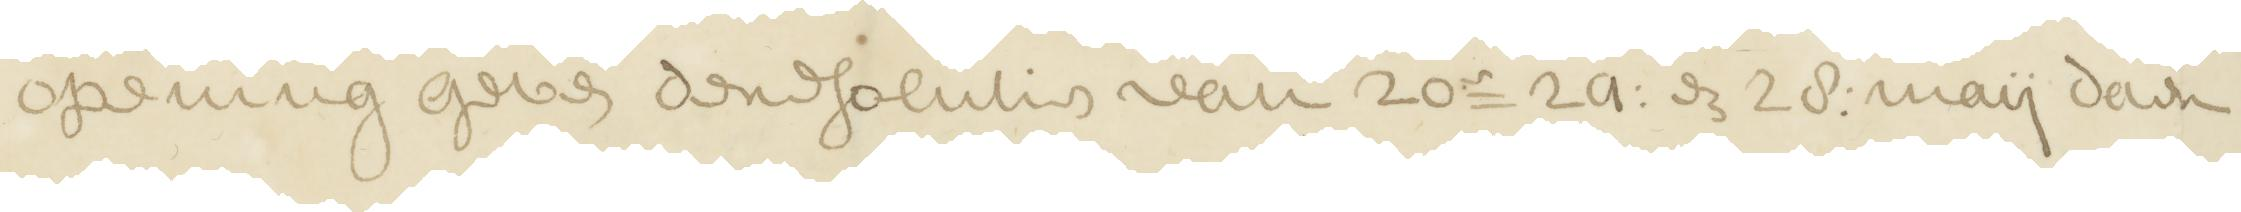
opening geven deresolutien van 20=e 24: en 28: maij daer
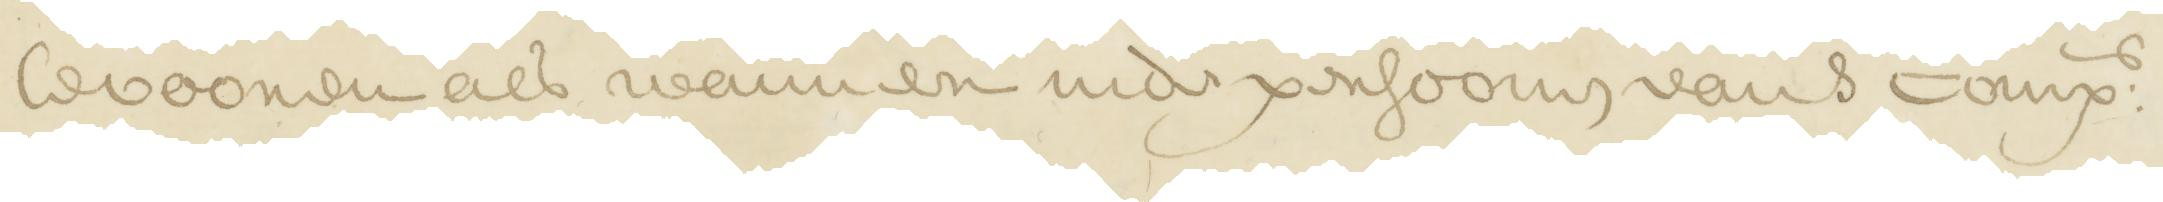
tevooren als wanner inde persoonen van 's Comp:s
